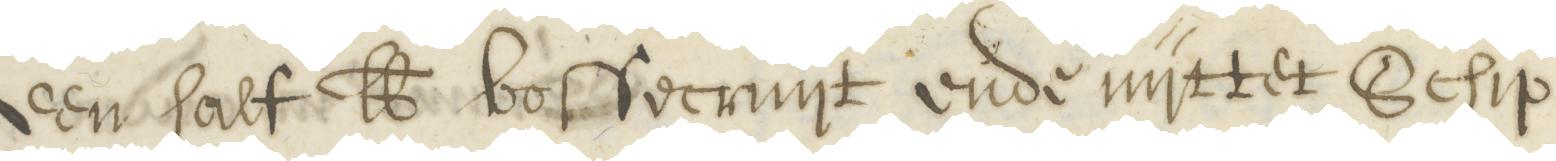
een half lb bossecruijt ende uijttet schip
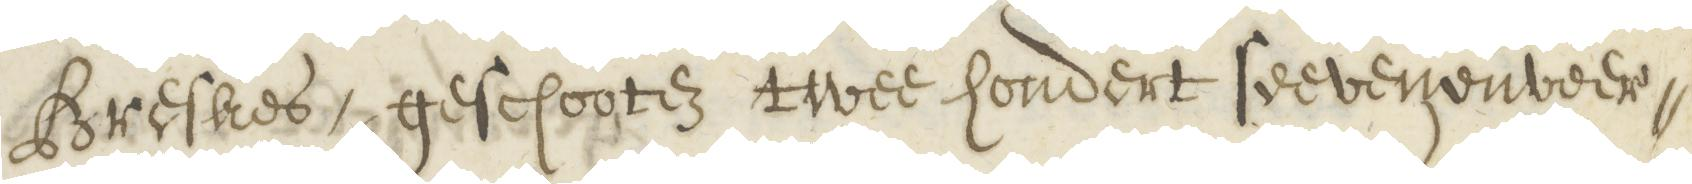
Breskes, geschooten twee hondert seevenenveer„
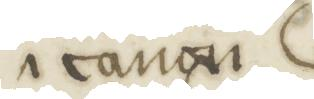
^ canon
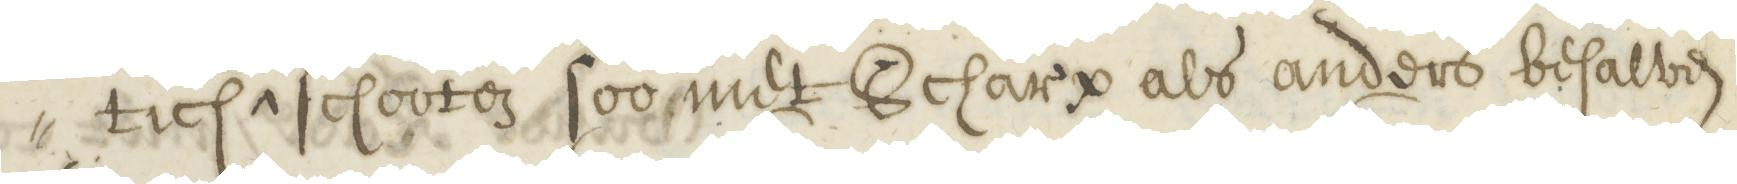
„tich ^schooten soo met scharp als anders behalven
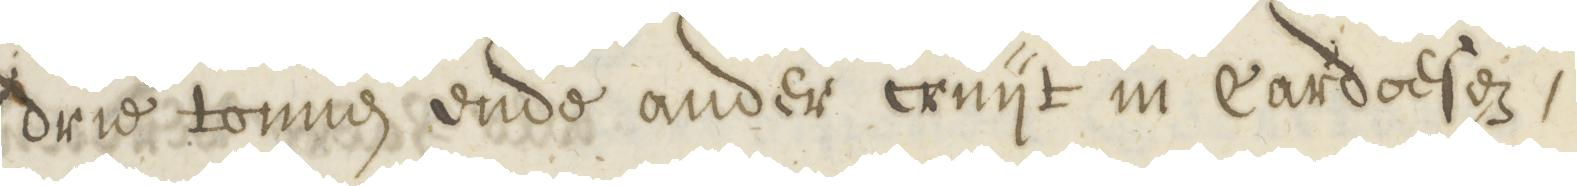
drie tonnen ende ander cruijt in Cardoesen,
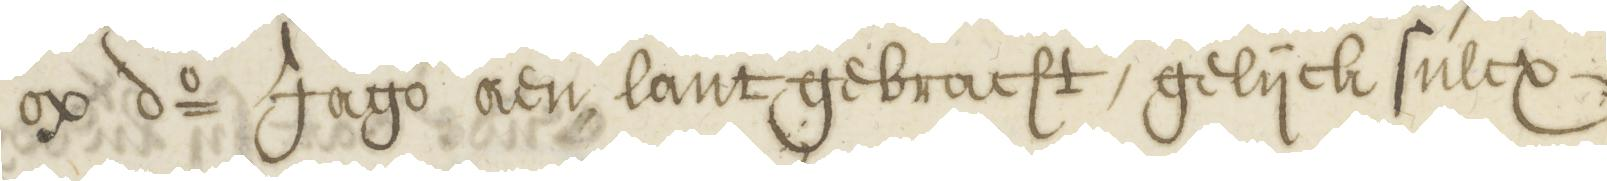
op d=o Jago aen lant gebracht, gelijck sulcx
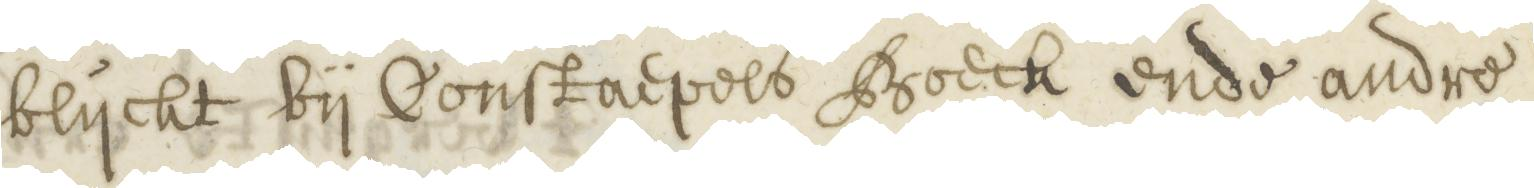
blijckt bij Constaepels Boeck ende andre
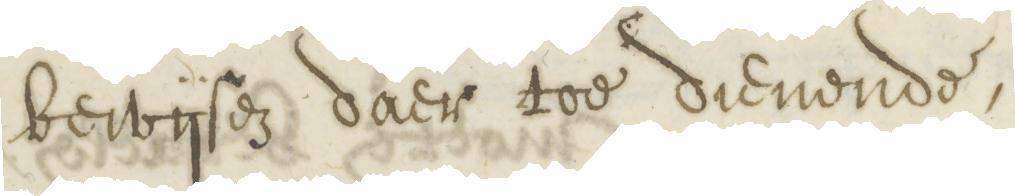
bewijsen daer toe dienende,
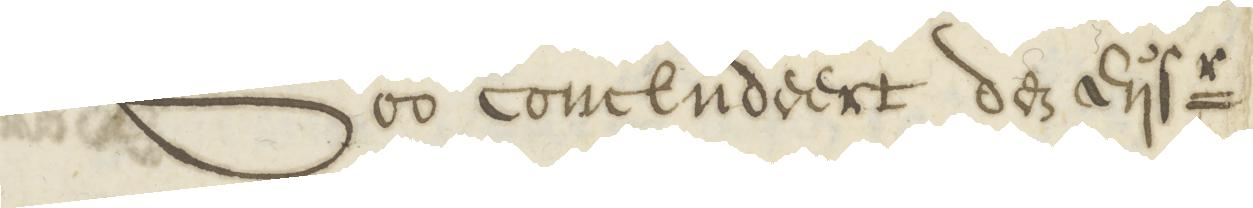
Soo concludeert den Eijs=r
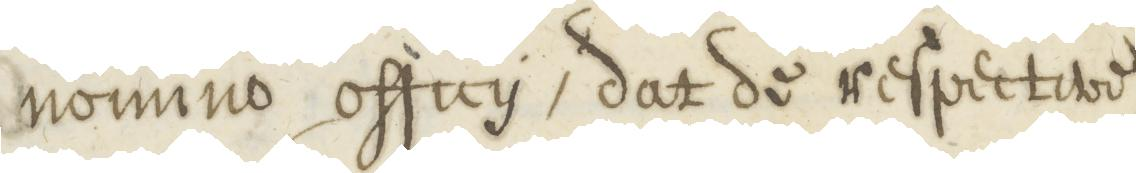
nomino officij, dat de respective
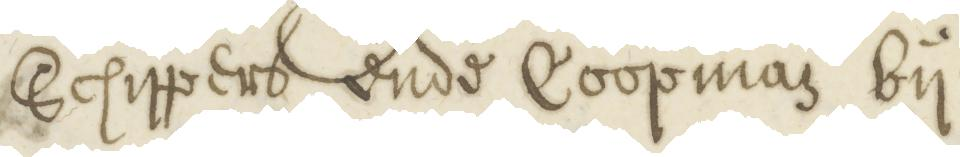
schippers ende Coopman bij
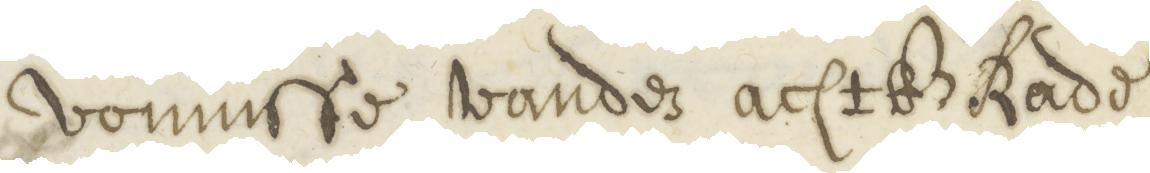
vonnisse vanden achtb Rade
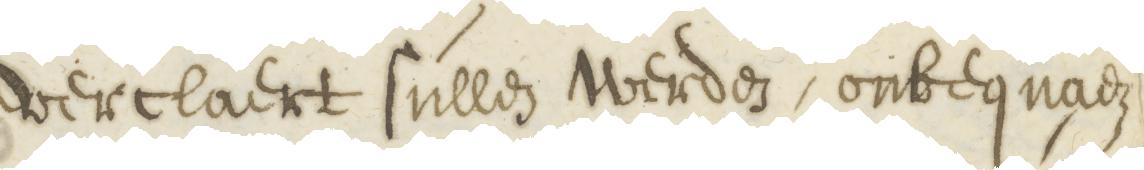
verclaert sullen werden, onbequaem
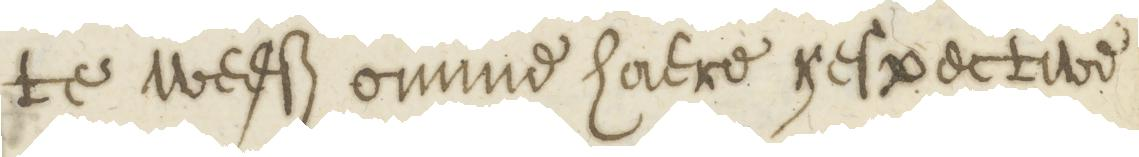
te wesen omme haere respective
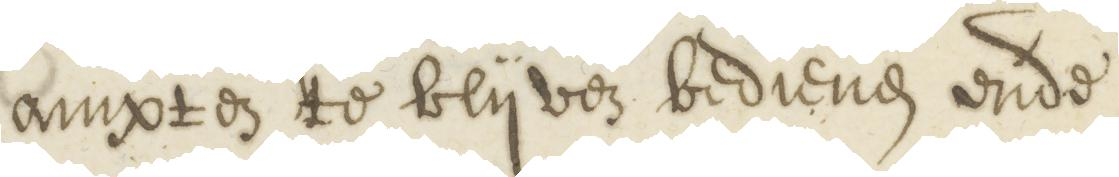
ampten te blijven bedienen ende
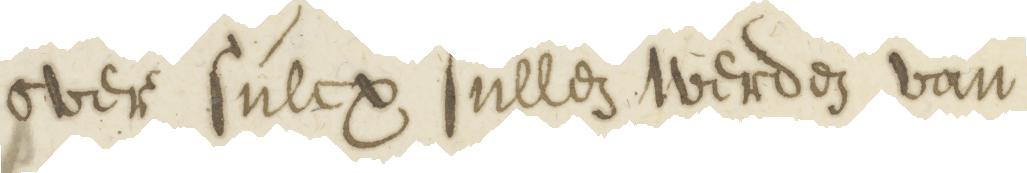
over sulcx sullen werden van
